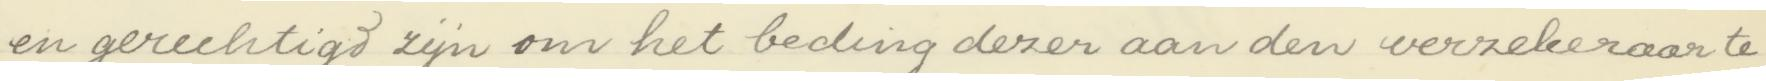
en gerechtigd zijn om het beding dezer aan den verzekeraar te
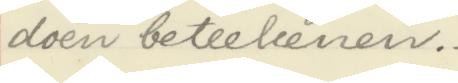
doen beteekenen.
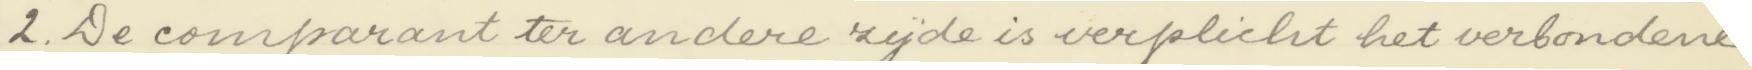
2. De comparant ter andere zijde is verplicht het verbondene
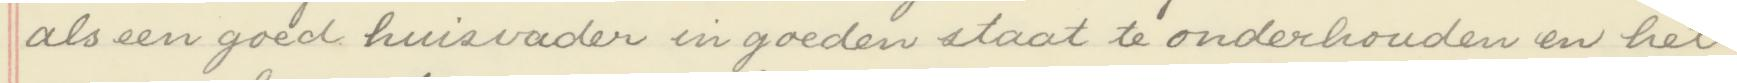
als een goed huisvader in goeden staat te onderhouden en het
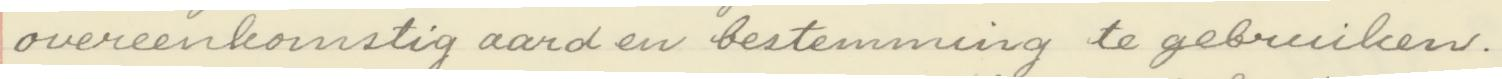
overeenkomstig aard en bestemming te gebruiken.
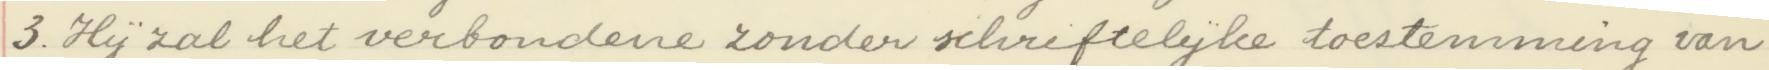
5. Hij zal het verbondene zonder schriftelijke toestemming van
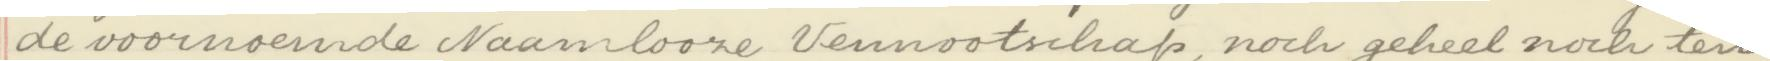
de voornoemde Naamlooze Vennootschap, noch geheel noch ten
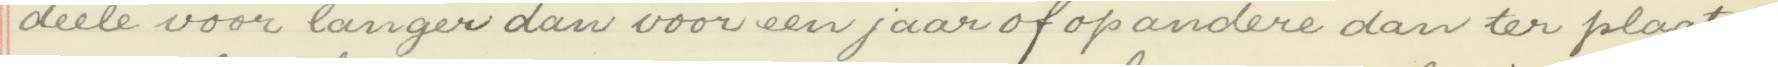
deele voor langer dan voor een jaar of op andere dan ter plaatse
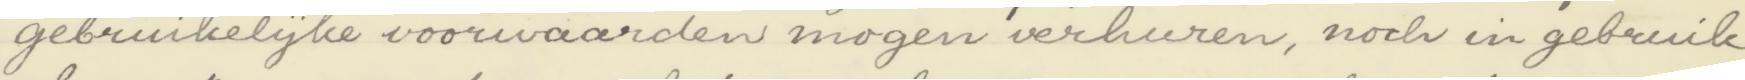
gebruikelijke voorwaarden mogen verhuren, noch in gebruik
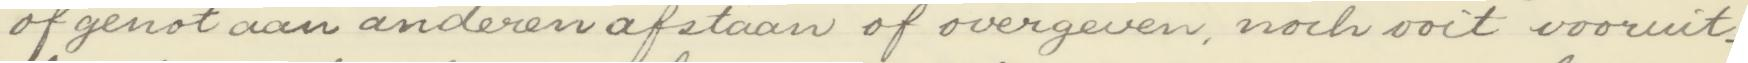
of genot aan anderen afstaan of overgeven, noch ooit vooruit
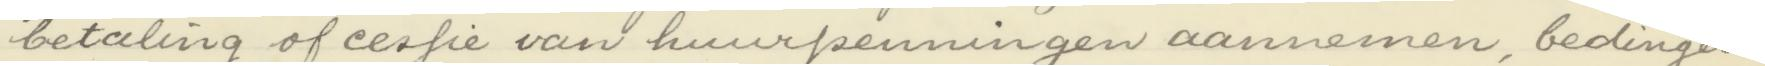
betaling of cessie van huurpenningen aannemen, bedingen
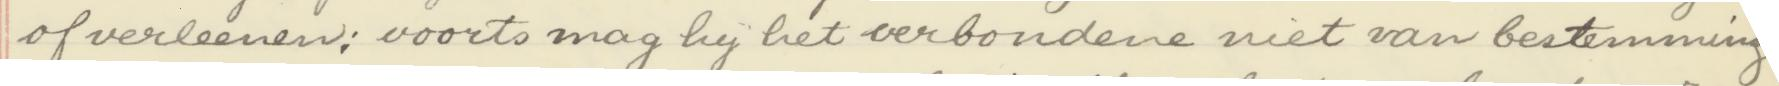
of verleenen; voorts mag hij het verbondene niet van bestemming
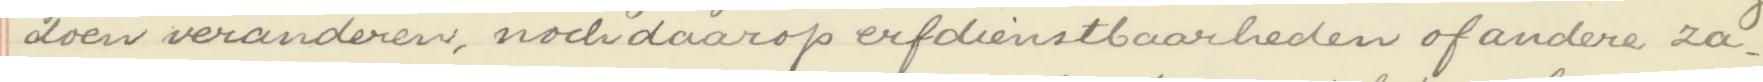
doen veranderen, noch daarop erfdienstbaarheden of andere za-
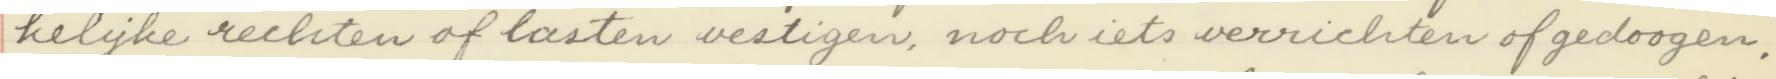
kelijke rechten of lasten vestigen, noch iets verrichten of gedoogen
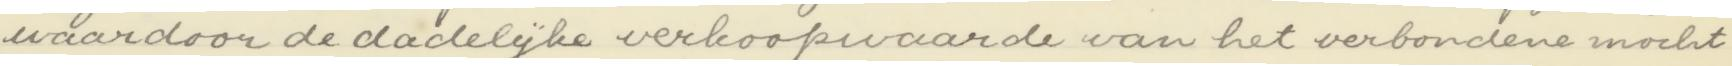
waardoor de dadelijke verkoopwaarde van het verbondene mocht
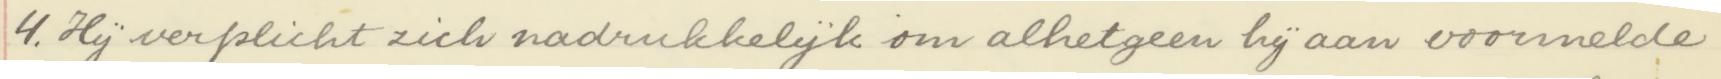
1. Hij verplicht zich nadrukkelijk om alhetgeen hij aan voormelde
